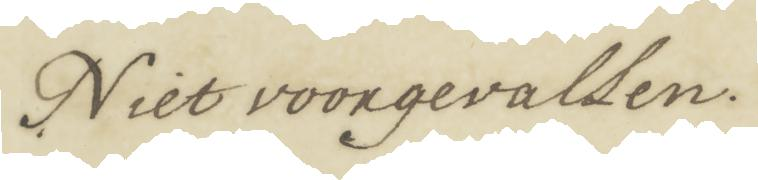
Niet voorgevallen.
